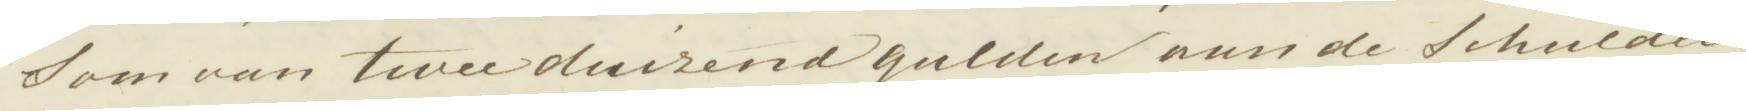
Som van twee duizend gulden aan de schuldei
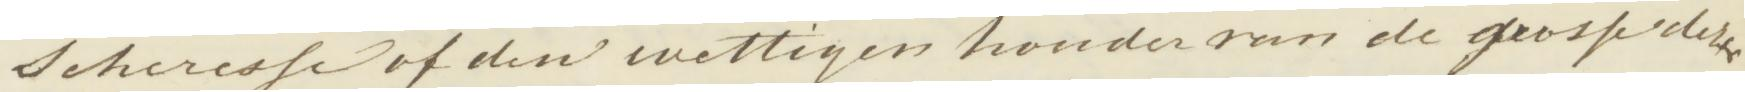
scheresse of den wettigen houder van de grosse dezer
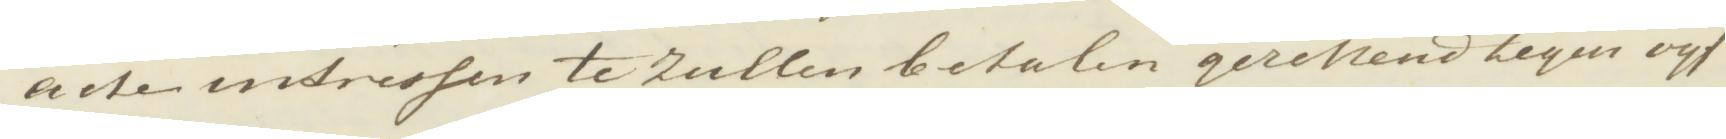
acte intressen te zullen betalen gerekend tegen vyf
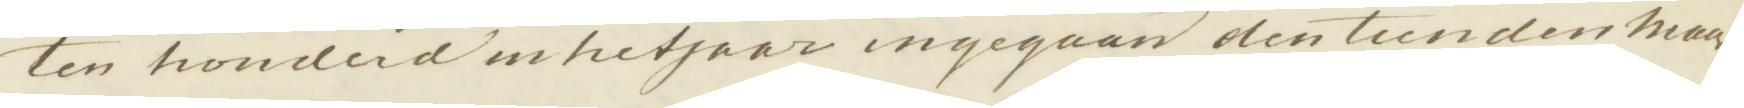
ten honderd in hetjaar ingegaan den tienden Maart
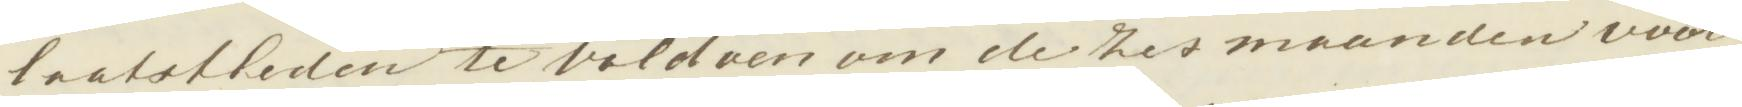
laatstleden te voldoen om de zes maanden voor
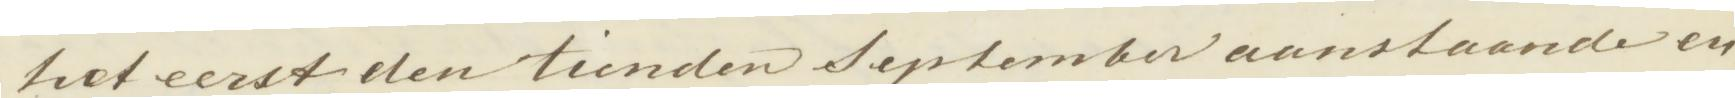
het eerst den tienden September aanstaande en
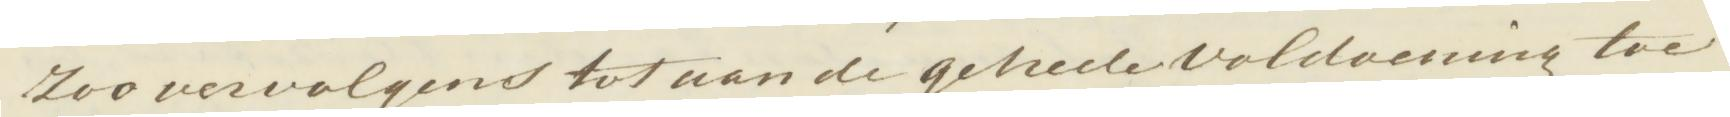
zoo vervolgens tot aan de geheele voldoening toe
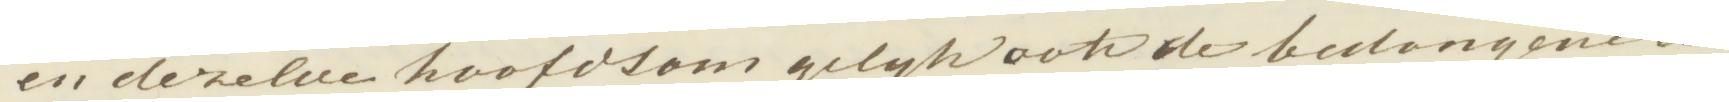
en dezelve hoofdsom gelyk ook de bedongene in
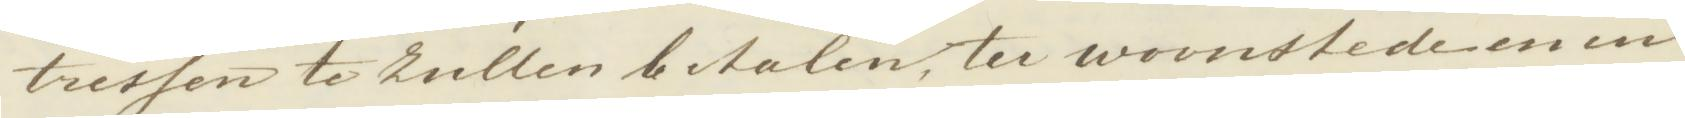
tressen te zullen betalen, ter woonstede en in
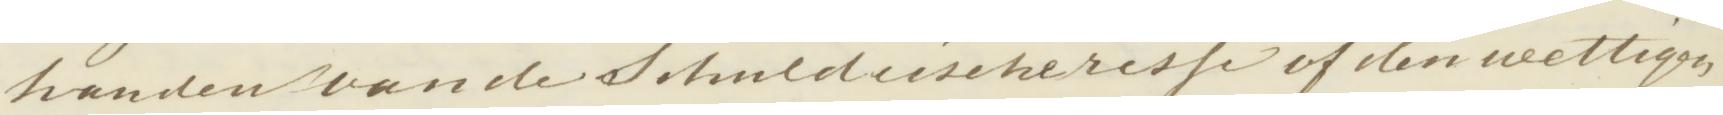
handen van de Schuldeischeresse of den wettigen
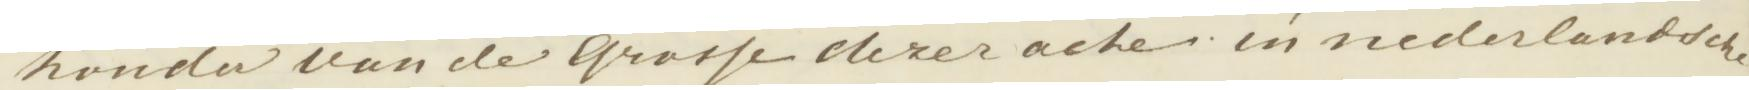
houder van de Grosse dezer acte in nederlandsche
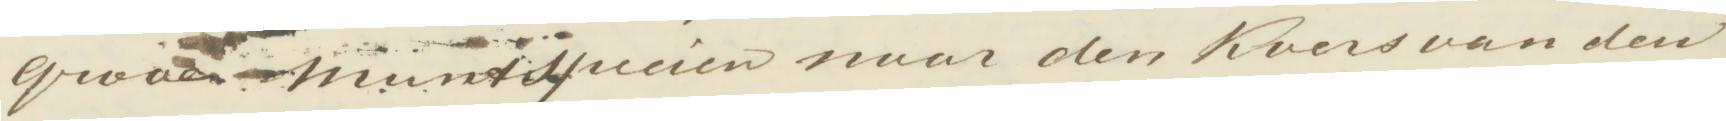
Groaen Muntspecien naar den Koers van den
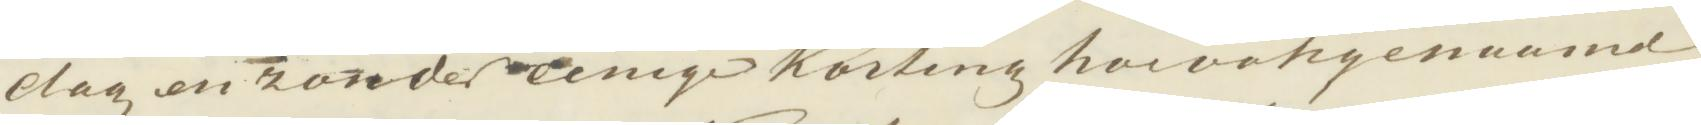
dag en zonder eenige korting hoe ook genaamd
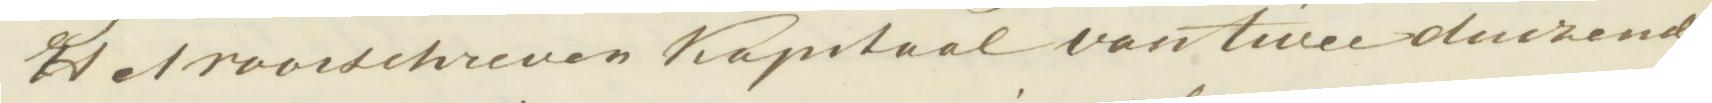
Het voorschreven Kapitaal van twee duizend
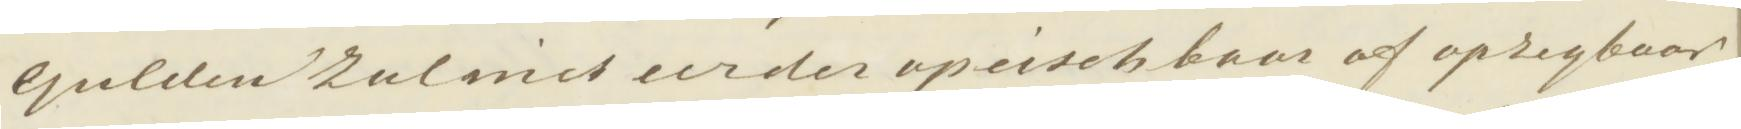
Gulden zal niet eerder op eischbaar af opzegbaar
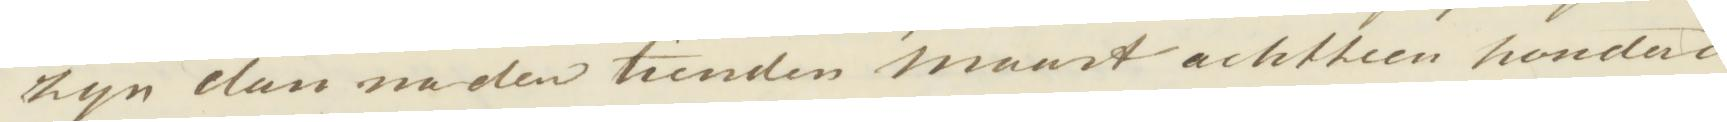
zyn dan naden tienden Maart achttien honderd
